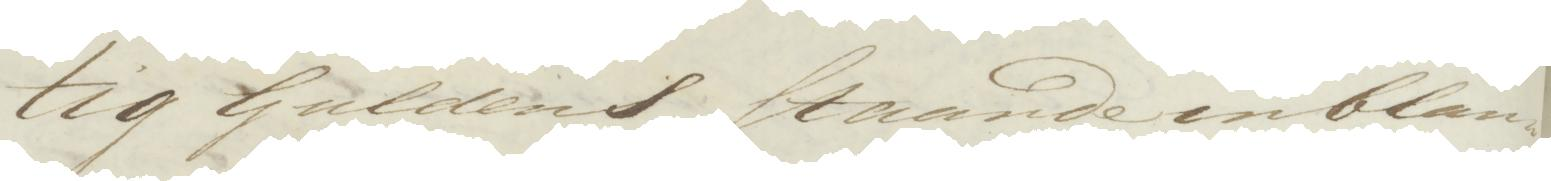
tig Guldens, staande in blan„
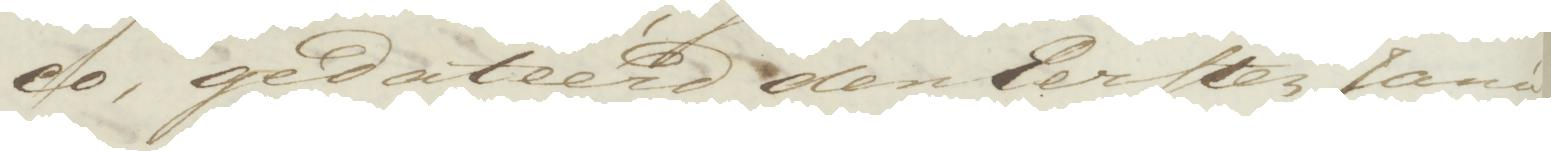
co, gedateerd den Eersten Janu
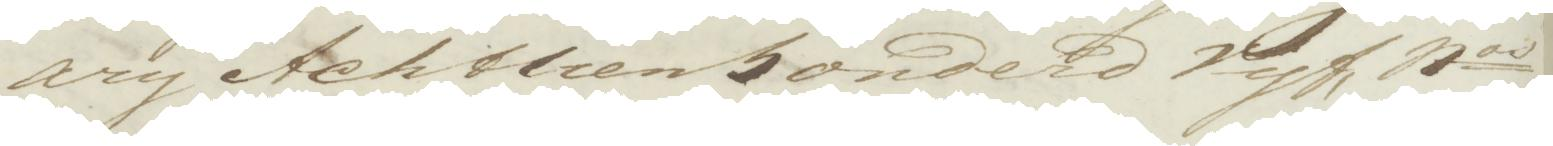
ary Achttienhonderd Vyf, N=os
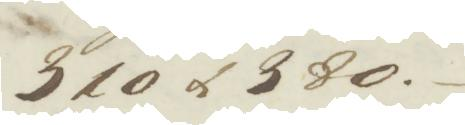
310 & 380.
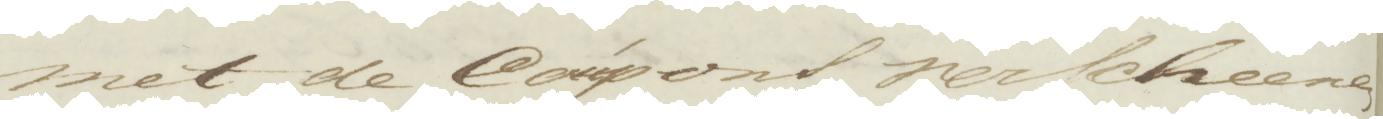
met de Coupons verscheenen
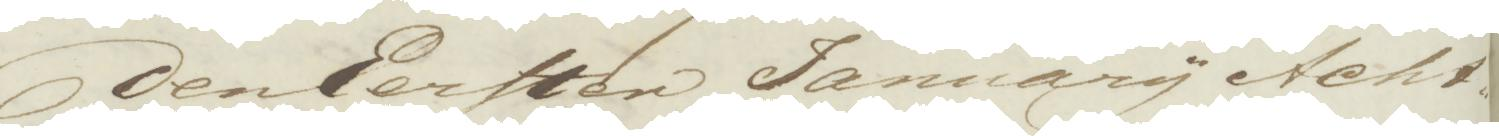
den Eersten Januarij Acht„
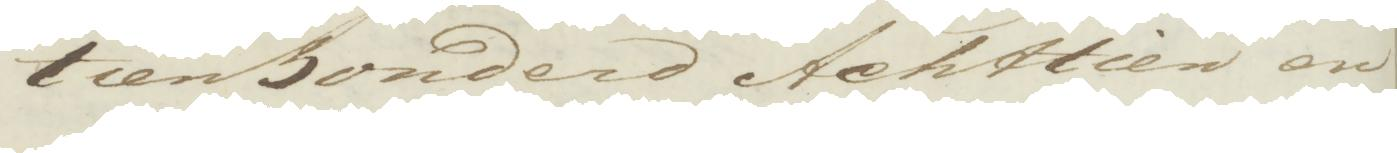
tien honderd Achttien en
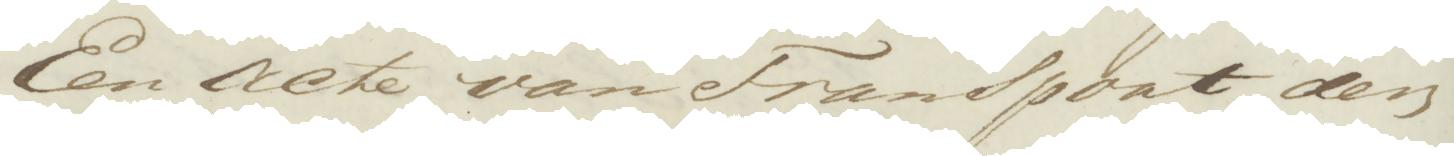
Een acte van Transport den
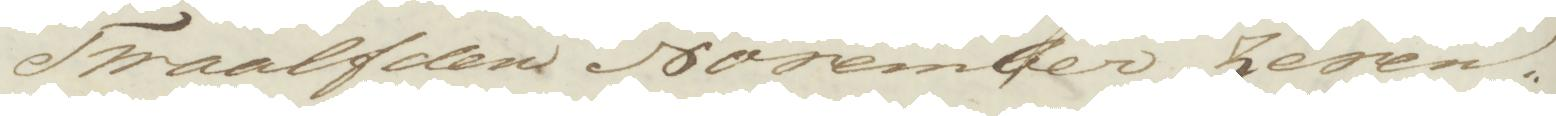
Twaalfden November Zeven„
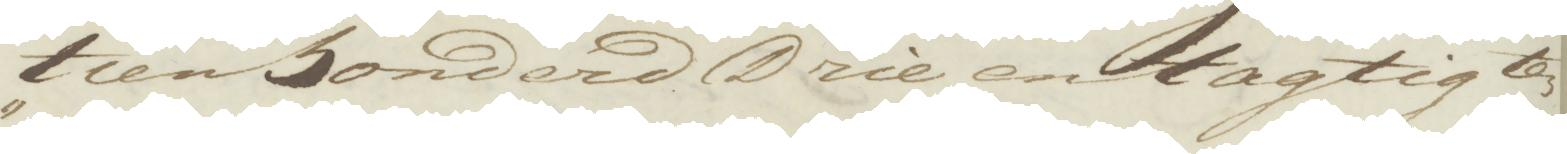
„tien honderd Drie en tagtig ten
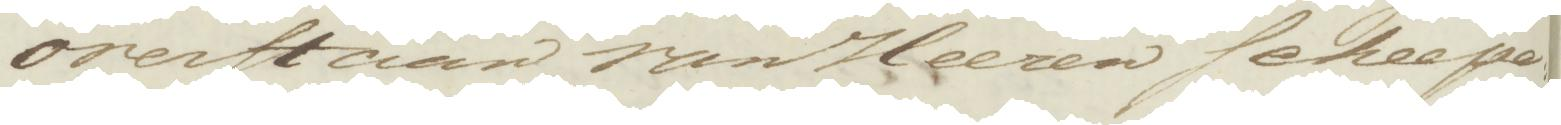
overstaan van Heeren scheepe„
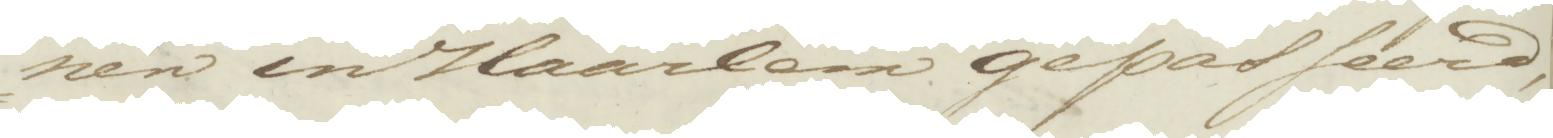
„nen in Haarlem gepasseerd,
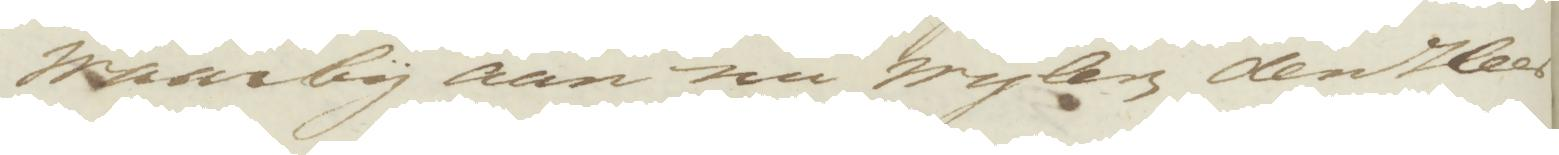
waarbij aan nu wylen den Heer
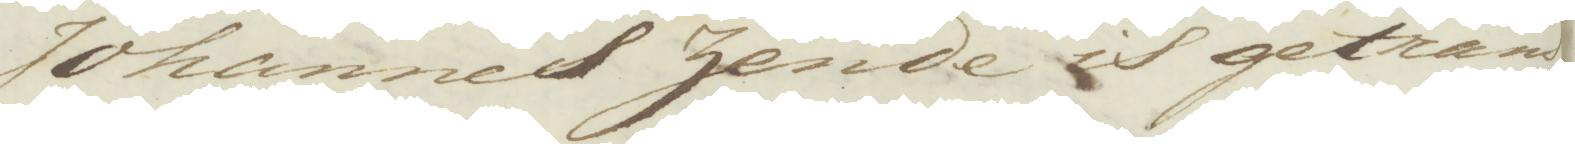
Johannes Zende is getrans
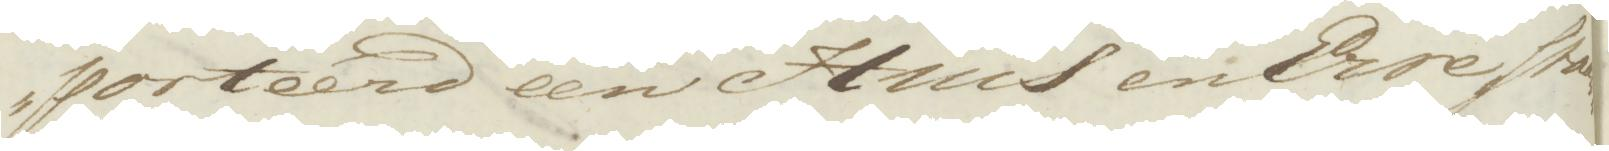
„porteerd een Huis en Erve sta
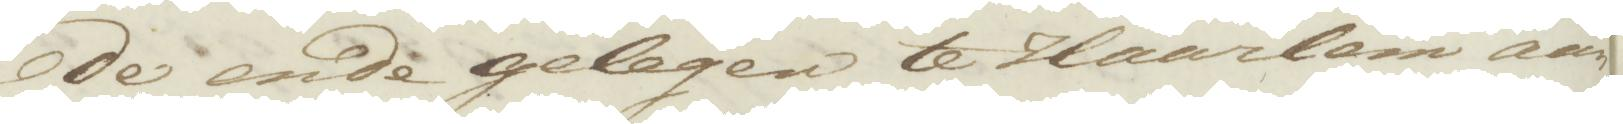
de ende gelegen te Haarlem aan
